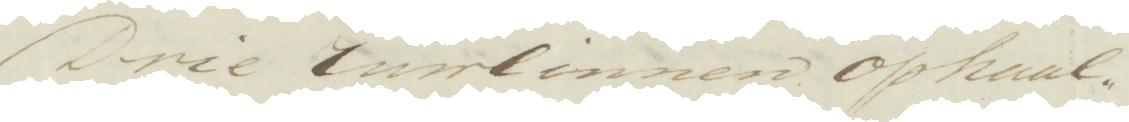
Drie ruwlinnen ophaal„
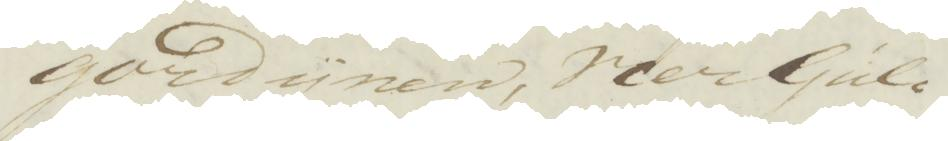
gordijnen, vier Gul„
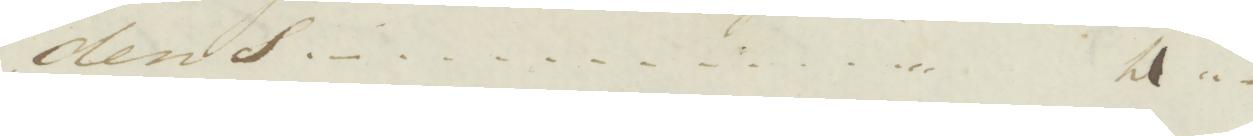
dens. 4 „
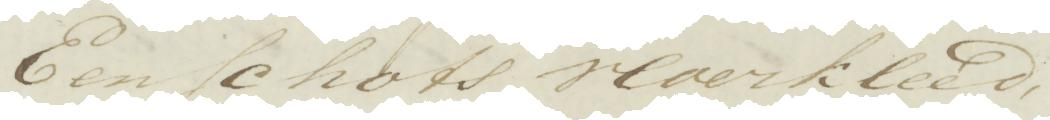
Een Schots vloerkleed,
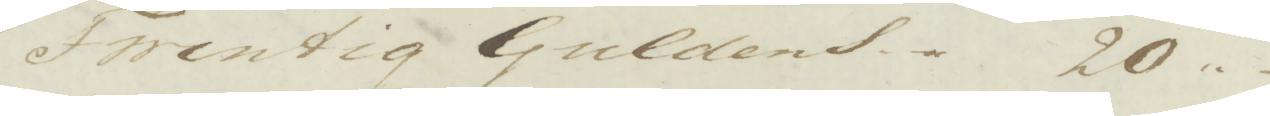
Twintig Guldens „ 20 „
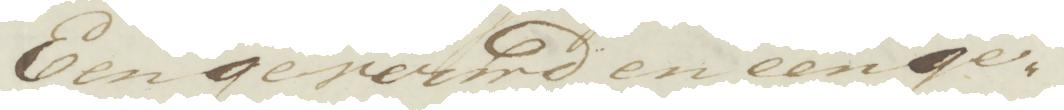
Een geverwd en een ge„
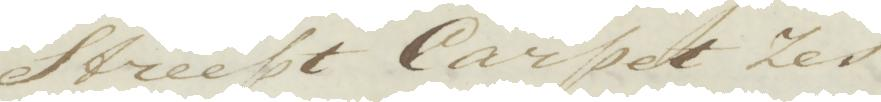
streept Carpet Zes
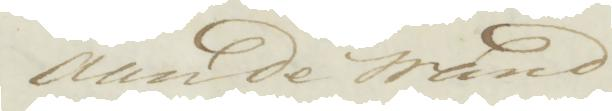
Aan de wand
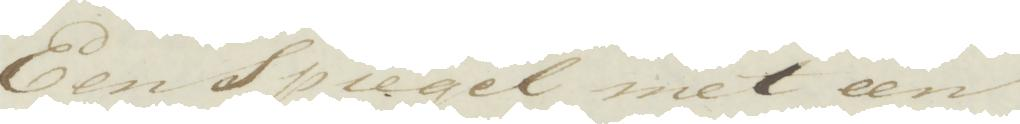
Een Spiegel met een
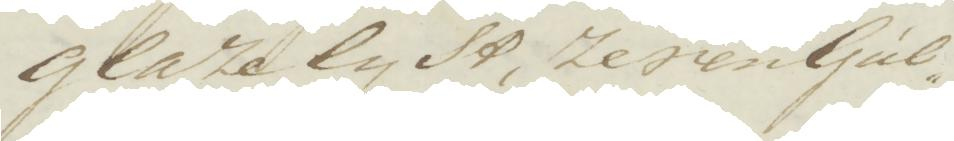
glaze lijst, Zeven Gul„
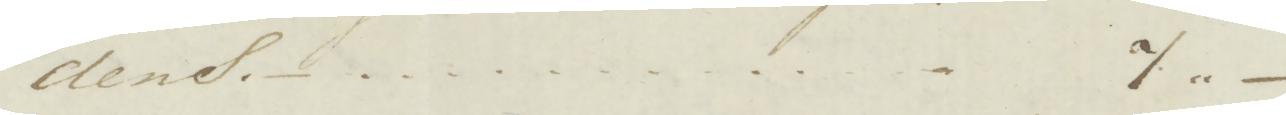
dens. 7 „-
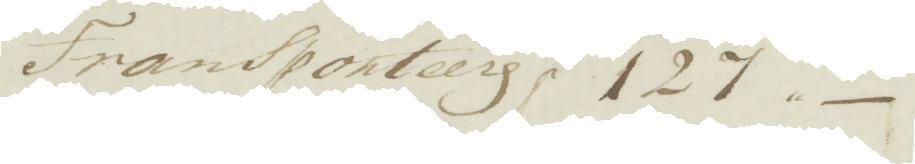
Transporteere ƒ 127 „-
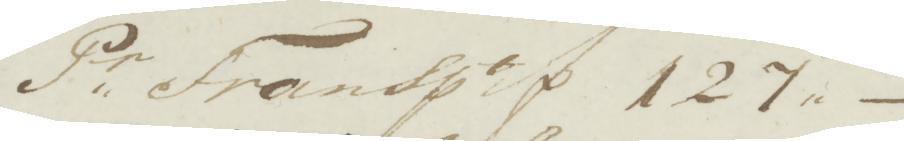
P„r Transp„t ƒ 127 „-
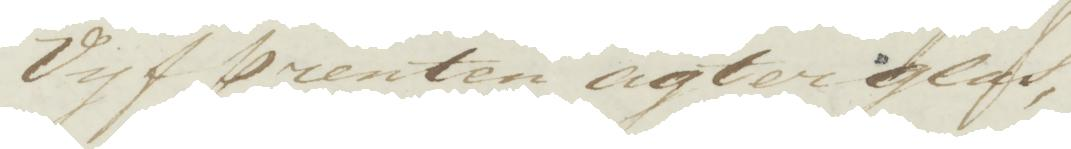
Vijf prenten agter glas,
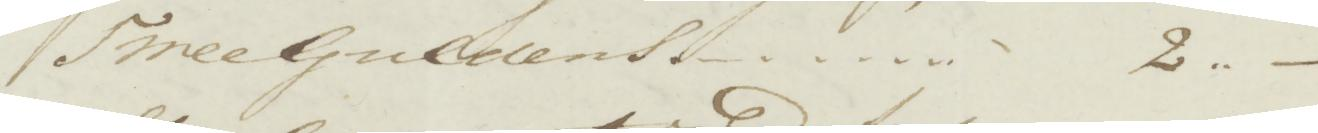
Twee Guldens. 2 „-
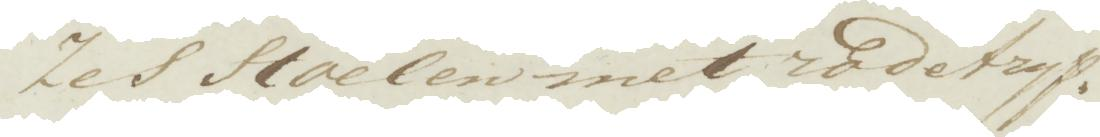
Zes stoelen met rodetrijp„
